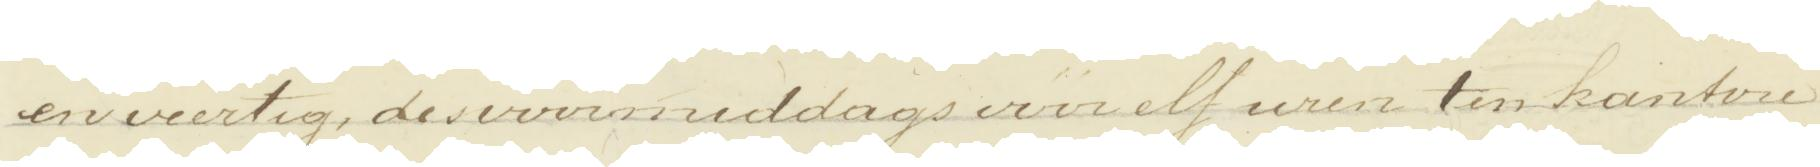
en veertig, des voormiddags voor elf uren ten kantore
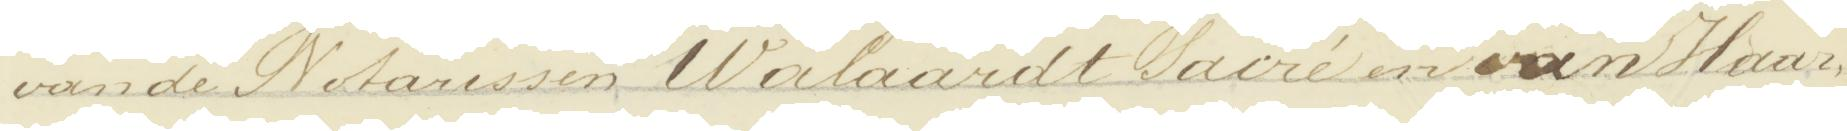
van de Notarissen Walaardt Sacré en van Haar,
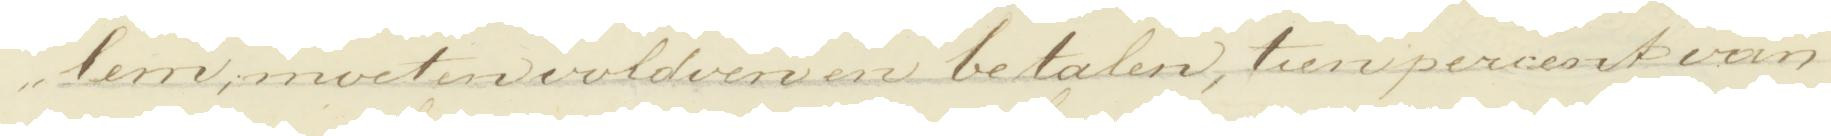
„lem, moeten voldoen en betalen, tien percent van
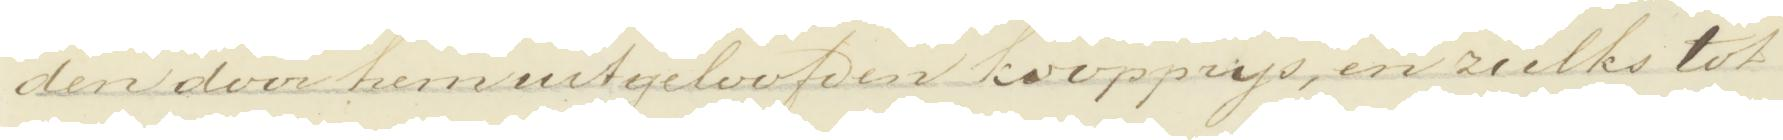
den door hem uitgeloofden koopprijs, en zulks tot
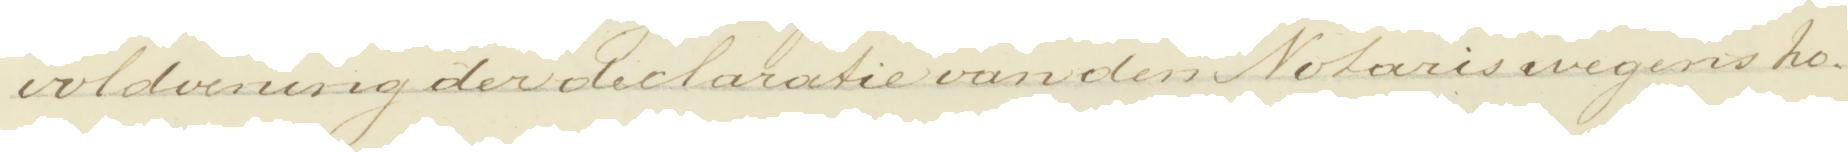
voldoening der declaratie van den Notaris wegens ho
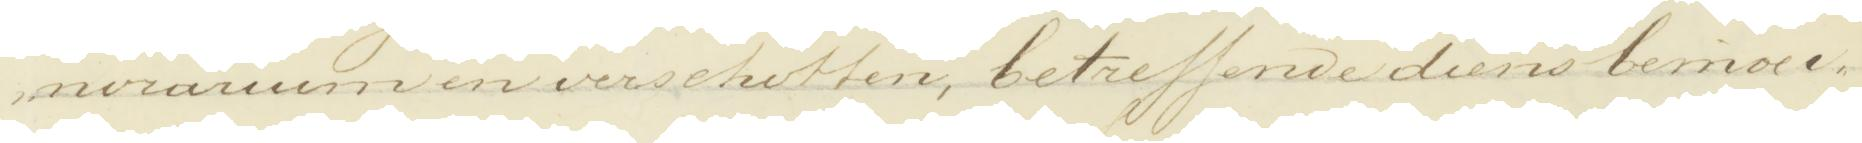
„norarium en verschotten, betreffende diens bemoei„
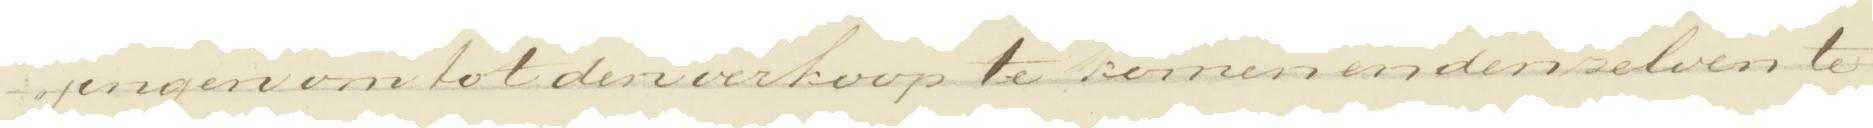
=jingen om tot den verkoop te komen en den zelven te
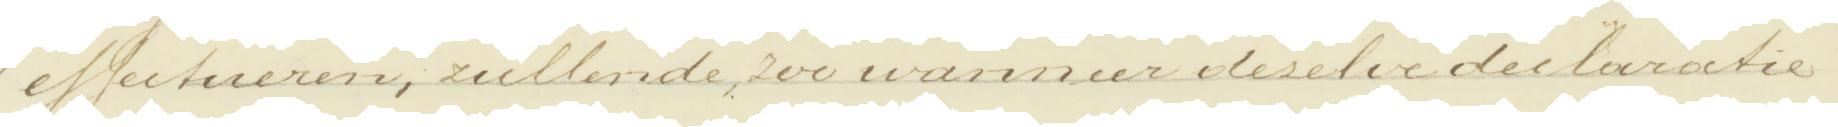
effectueren, zullende zoo wanneer dezelve declaratie
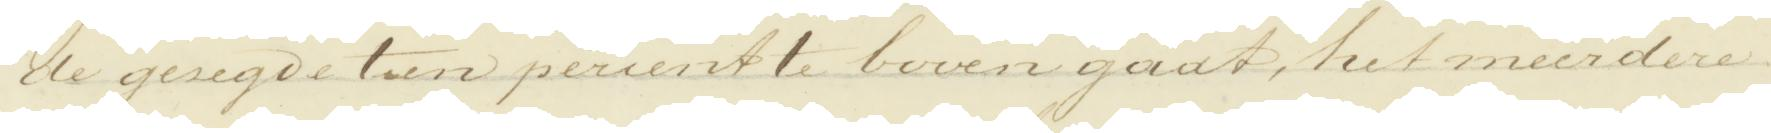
de gezegde tien percent te bovengaat, het meerdere
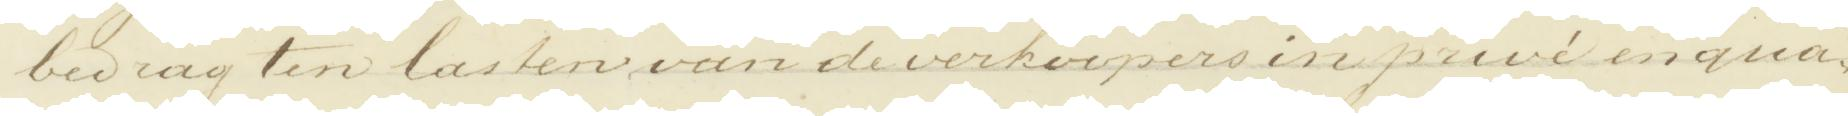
bedrag ten lasten van de verkoopers in privé en qua
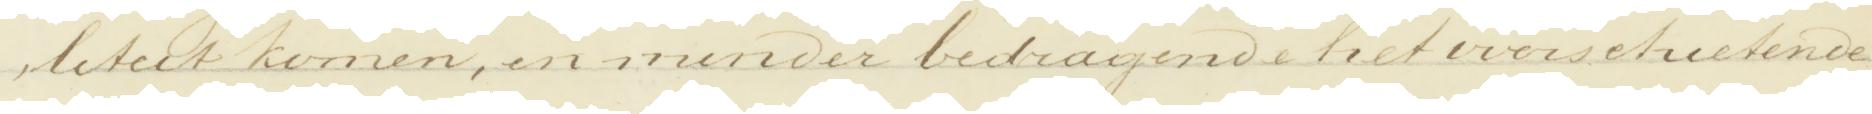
„liteit komen, en minder bedragende het overschietende
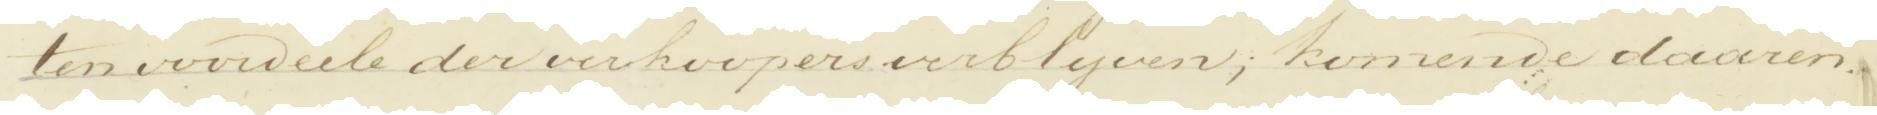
ten voordeele der verkoopers verblijven; komende daaren„
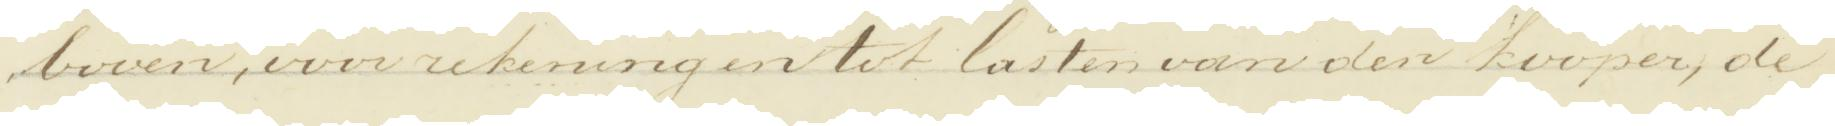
„boven, voor rekening en tot lasten van den kooper, de
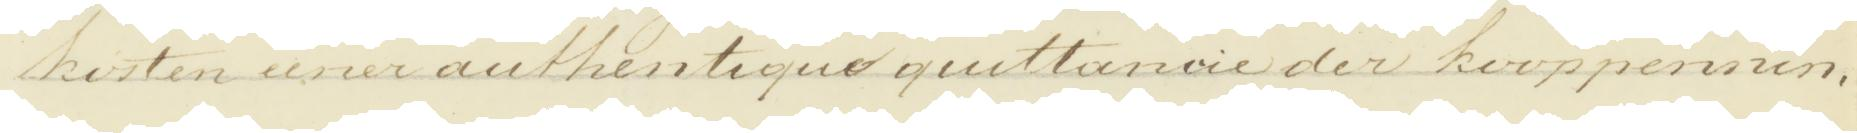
kosten eener authentique quittancie der kooppennin,
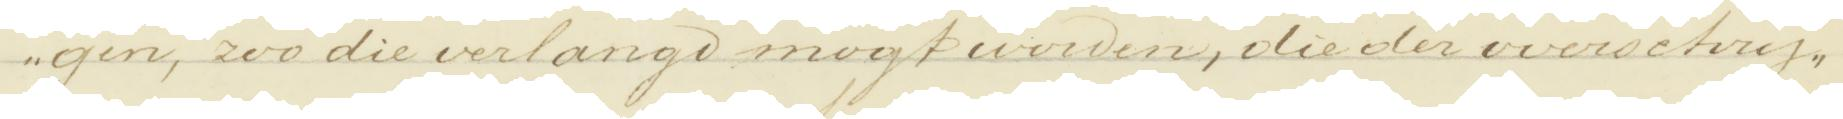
„gen, zoo die verlangd mogt worden, die der overschry„
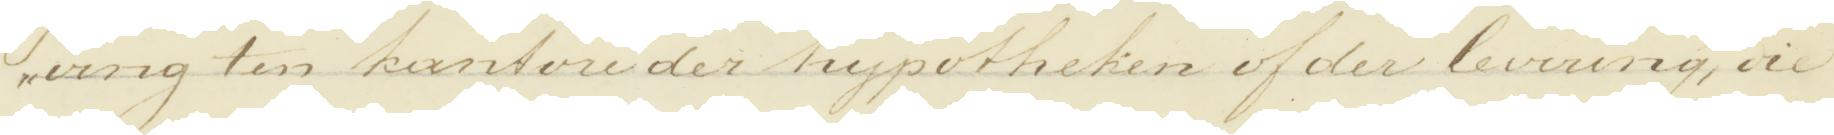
„ving ten kantore der hypotheken of der levering, die
